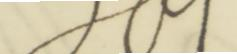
301
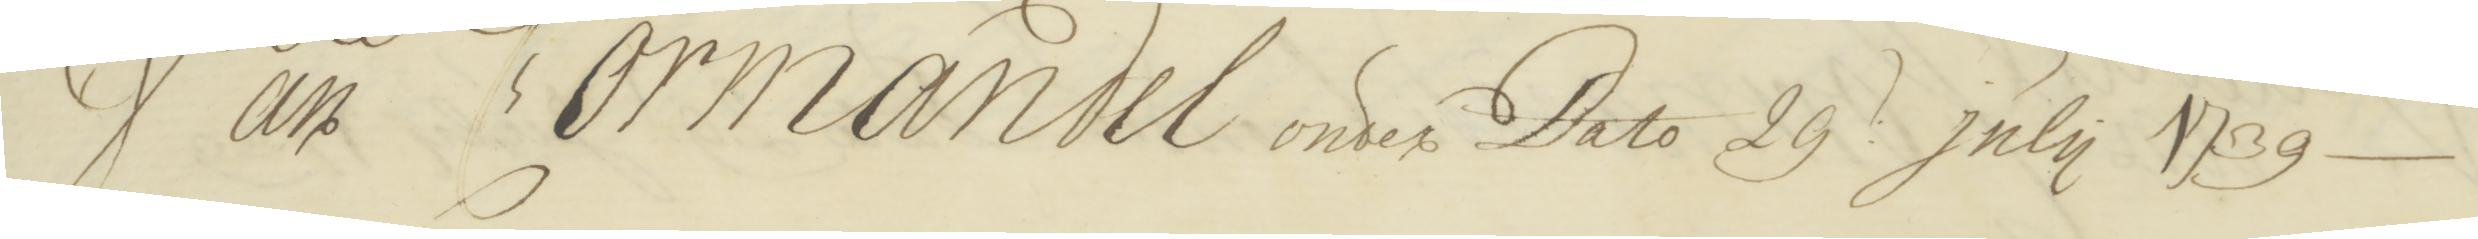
Van Cormandel onder Dato 29:' Julij 1739 —
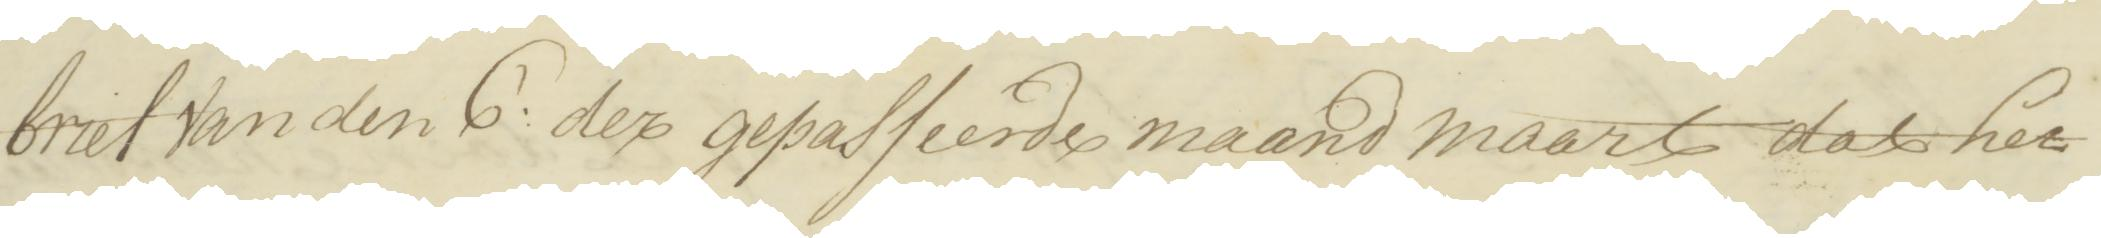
brief van den 6: der gepasseerde maand maart dat het
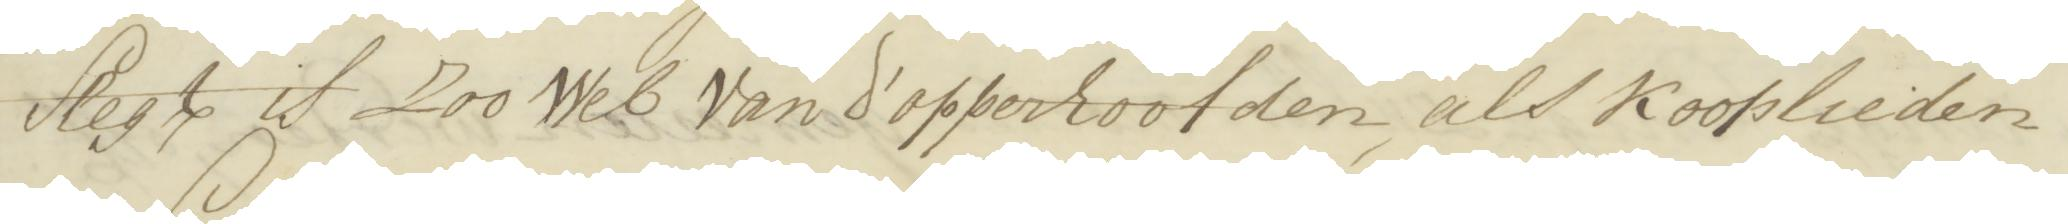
slegt is zoo wel van d’opperhoofden, als kooplieden
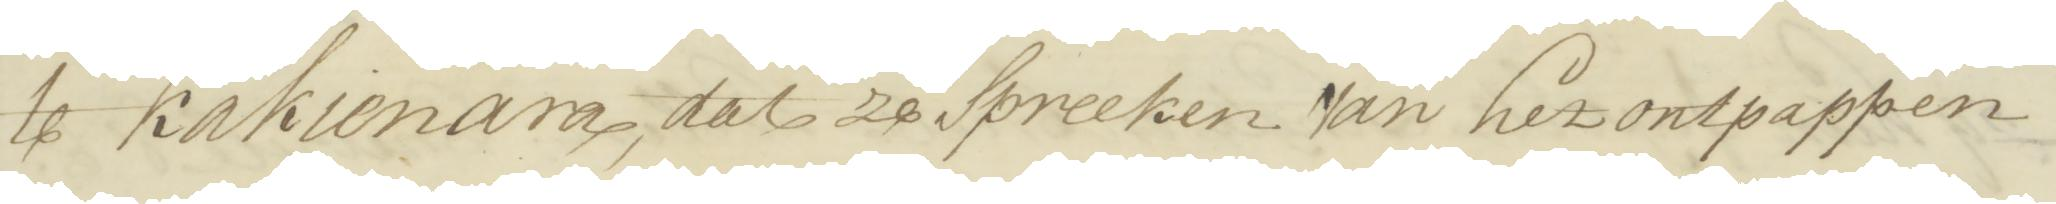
te kakienara, dat ze spreeken van het ontpappen
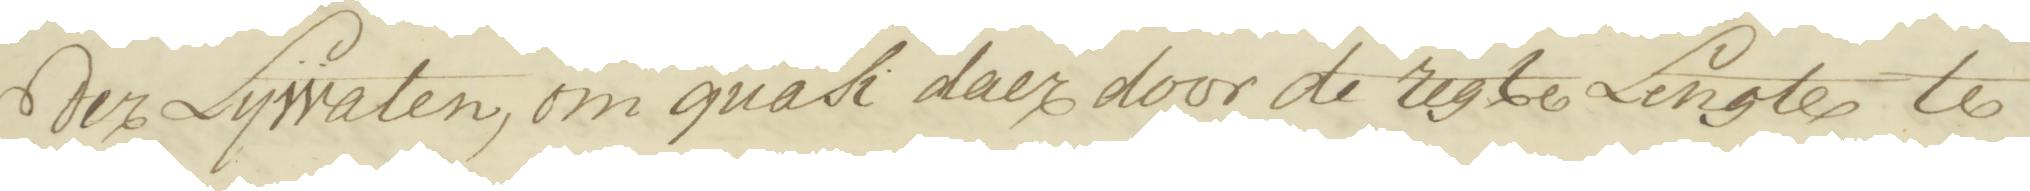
der Lijwaten, om quasi daer door de regte Lengte te
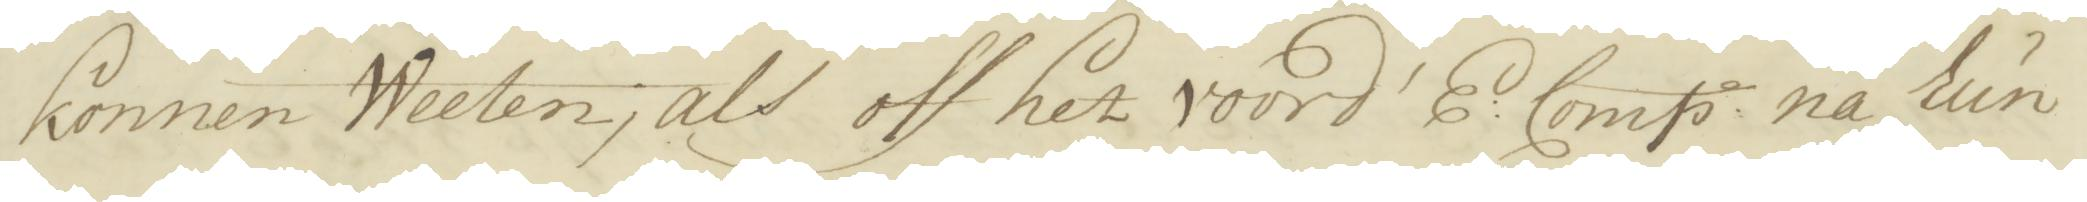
konnen Weeten, als off het voord’E: Comp: na hun
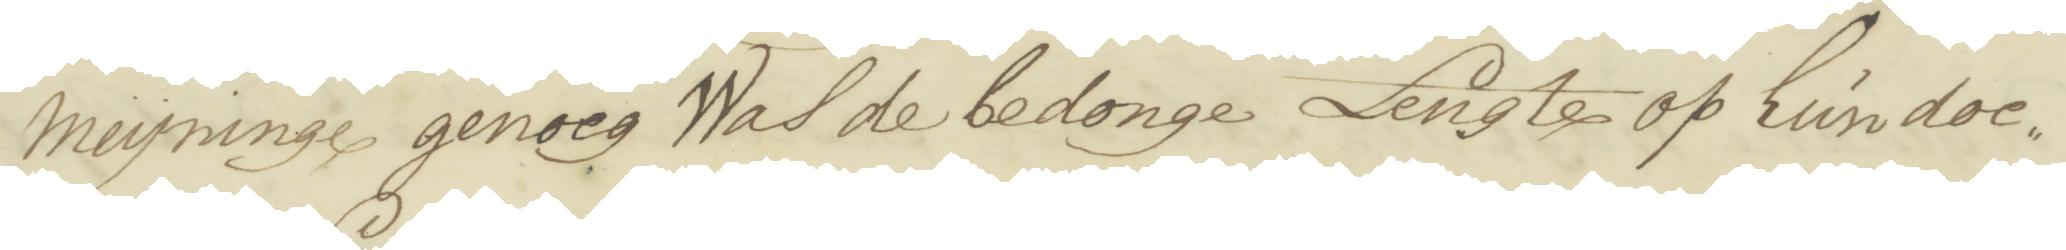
meijninge genoeg Was de bedonge Lengte op hun doe„
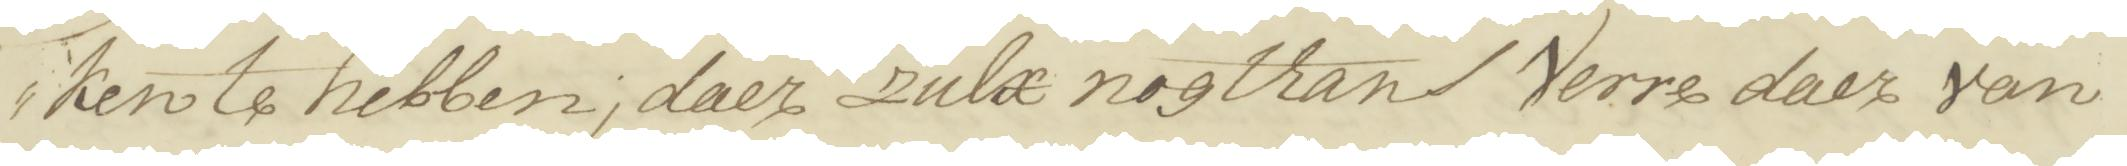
„ken te hebben; daer zulx nogthans verre daer van
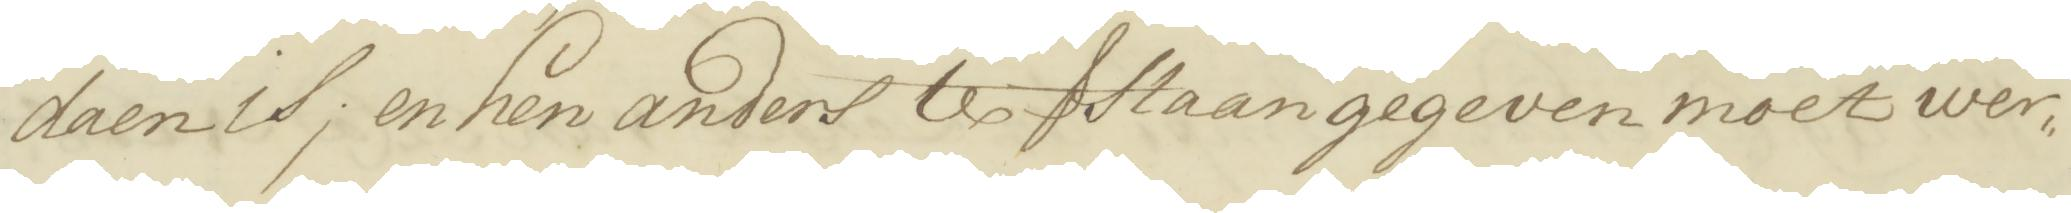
daen is; en hen anders te verstaan gegeven moet wer„
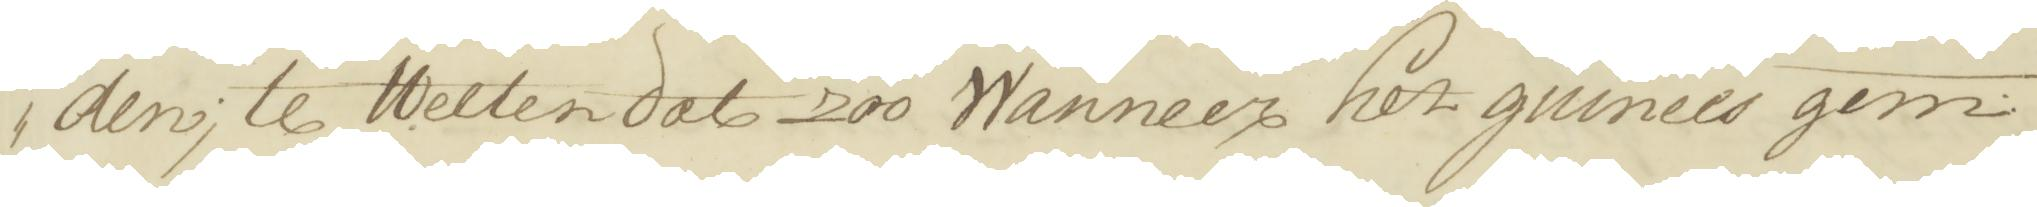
„den; te weeten dat zoo wanneer het guinees gem:
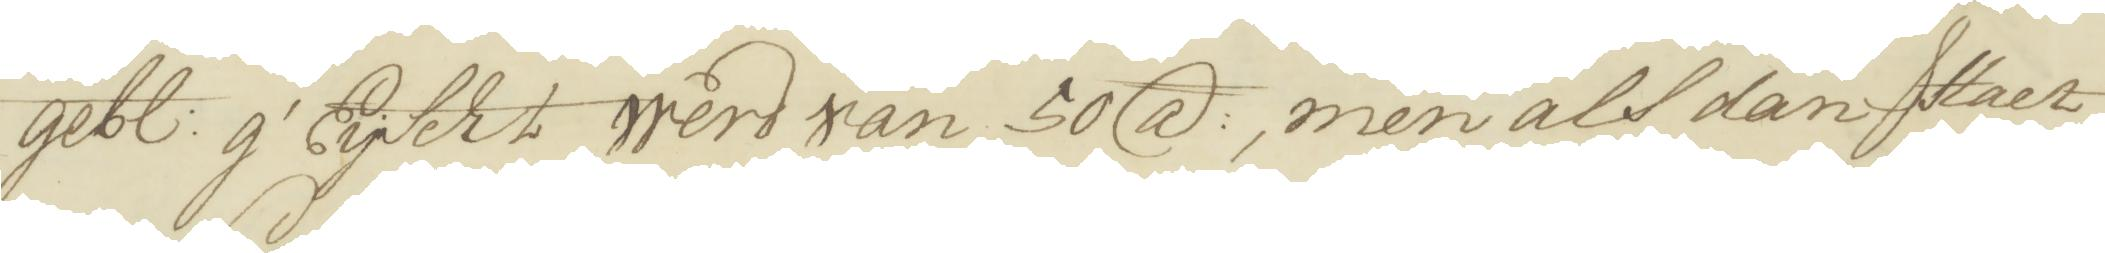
gebl: g’ Eijscht werd van 50 @:, men als dan verstaet
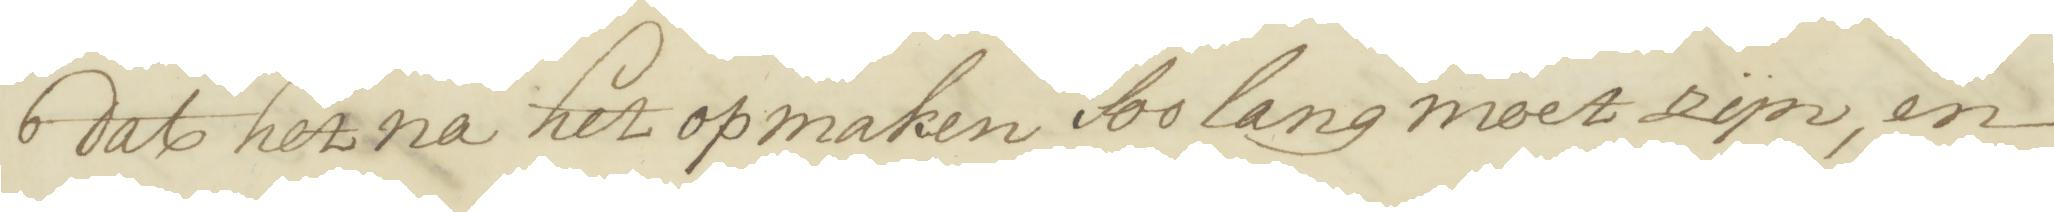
dat het na het opmaken soo lang moet zijn, en
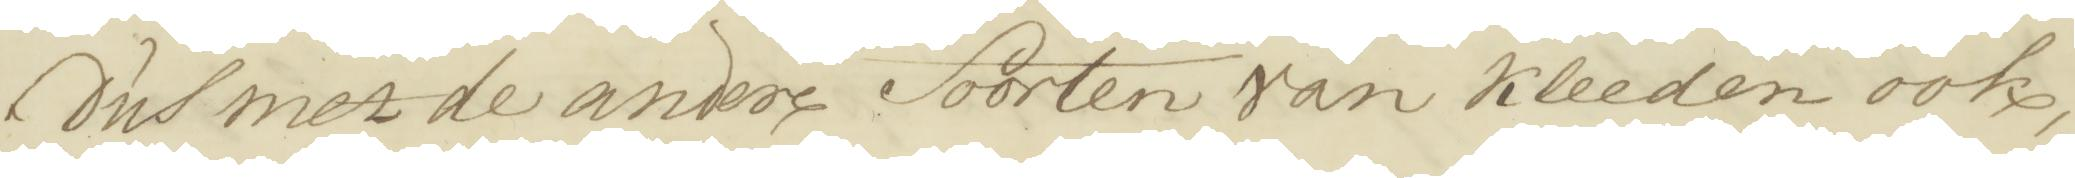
dus met de andere soorten van kleeden ook,
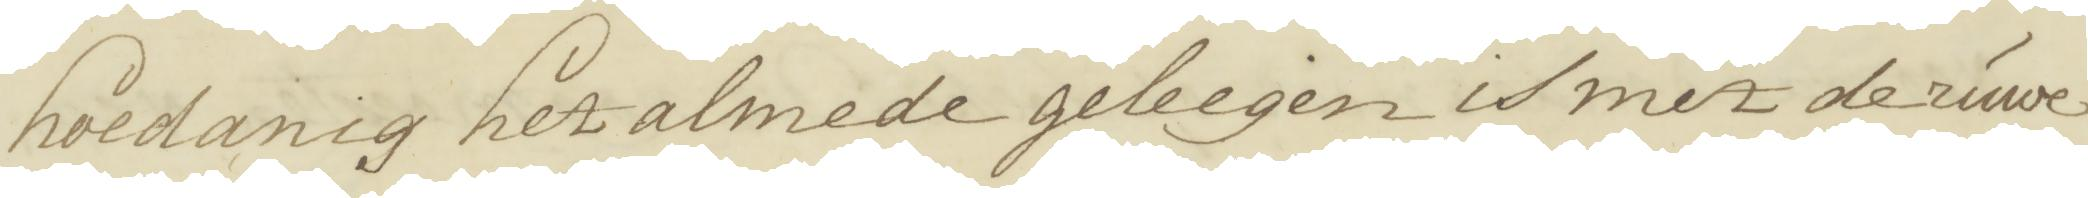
hoedanig het almede geleegen is met de ruwe
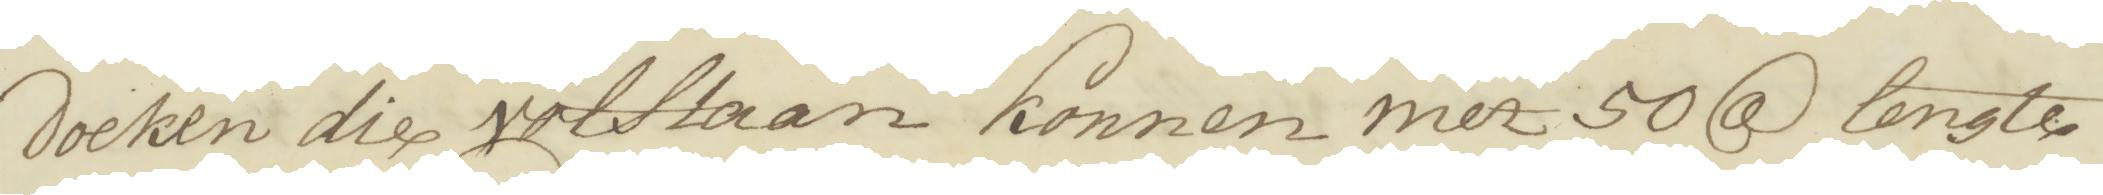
doeken die volstaan konnen met 50 @ lengte
